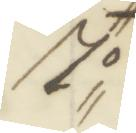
r„o
